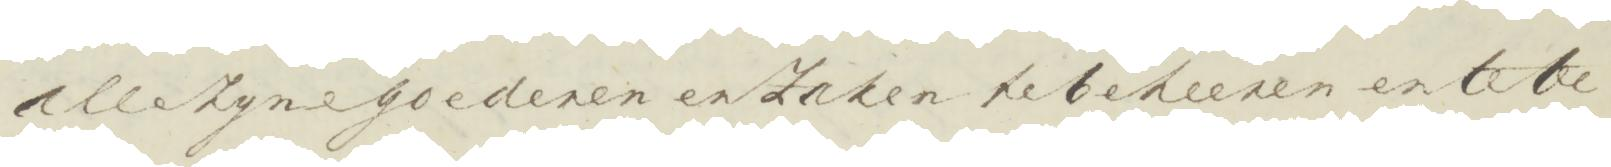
alle zyne goederen en zaken te beheeren en te be
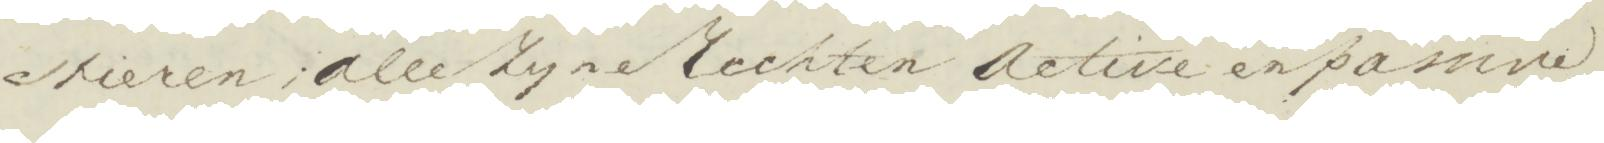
„stieren, alle zyne echten active en passive
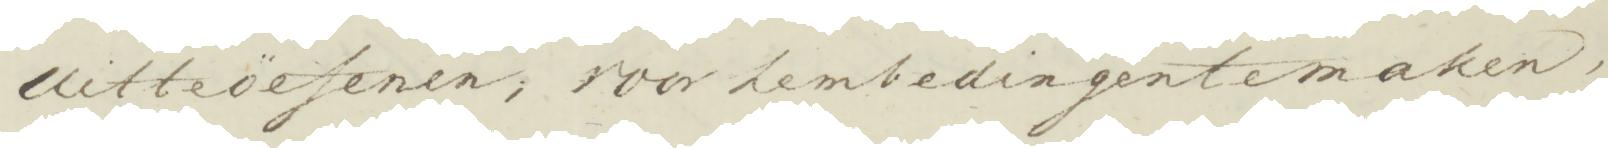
uit teöefenen, voor hem bedingen te maken,
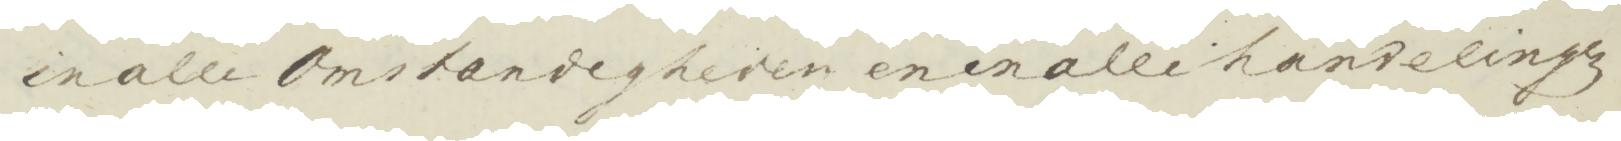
in alle omstandigheden en in alle handelingen
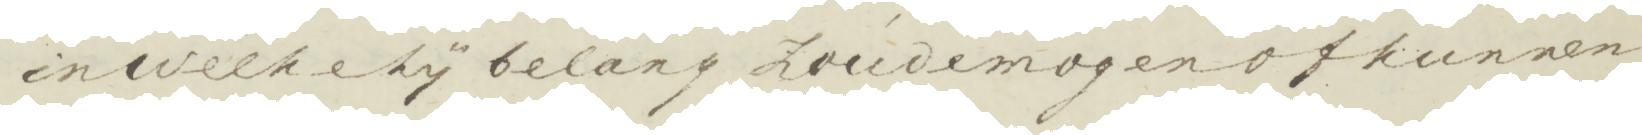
in welke hij belang zoude mogen of kunnen
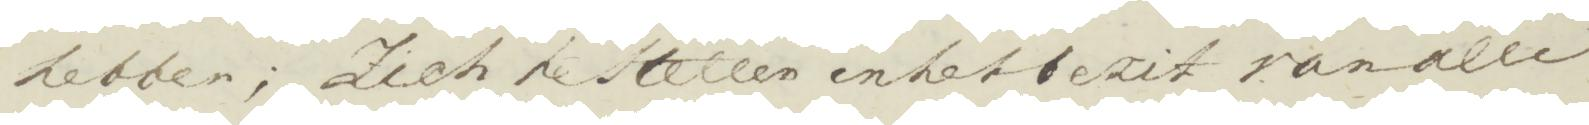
hebben; zich te stellen in het bezit van alle
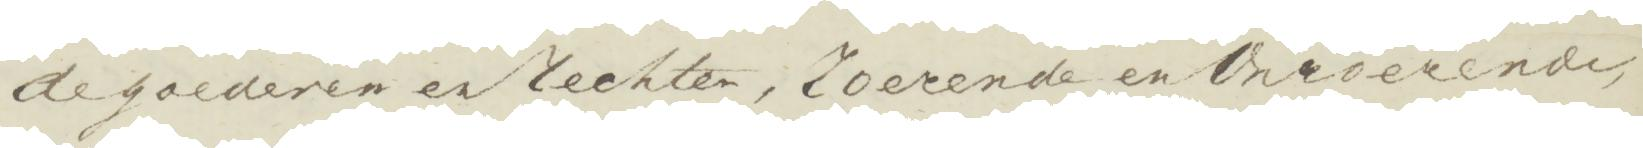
de goederen en rechten, roerende en onroerende,
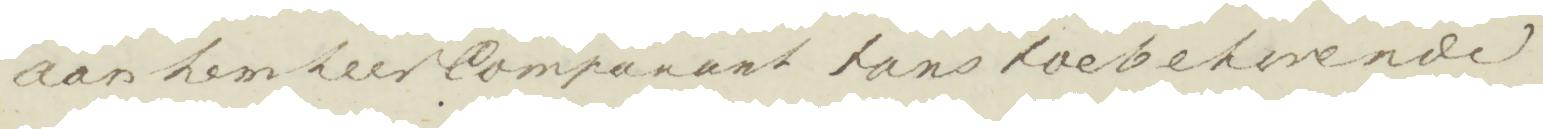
aan hem heer Comparant tans toebehorende
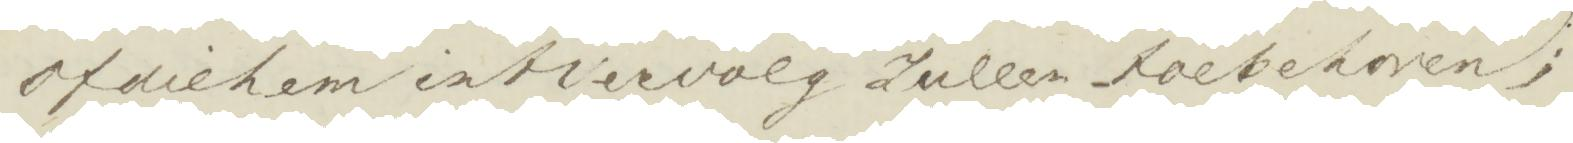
of die hem in't vervolg zullen toebehoren;
